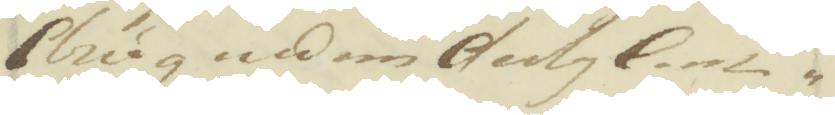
Drie guldens dertig Cent „
